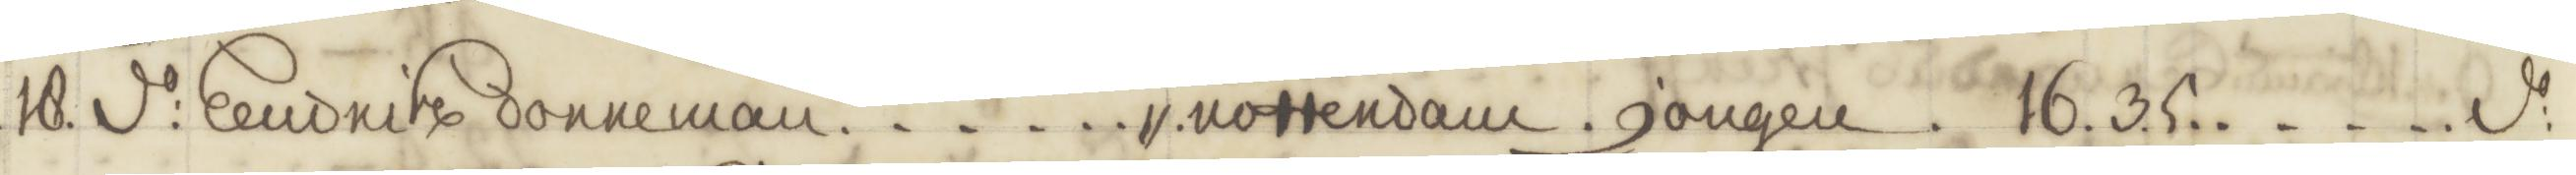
18. d:o hendrik dorreman . - - - . . „ . rotterdam . jongen . 16.3.5. - - - - . d:o
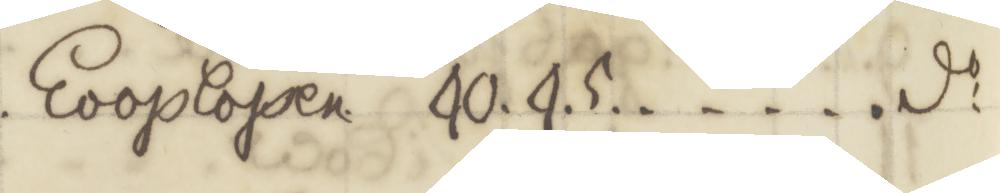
hooploper. 40.4.5. - - - . . d:o
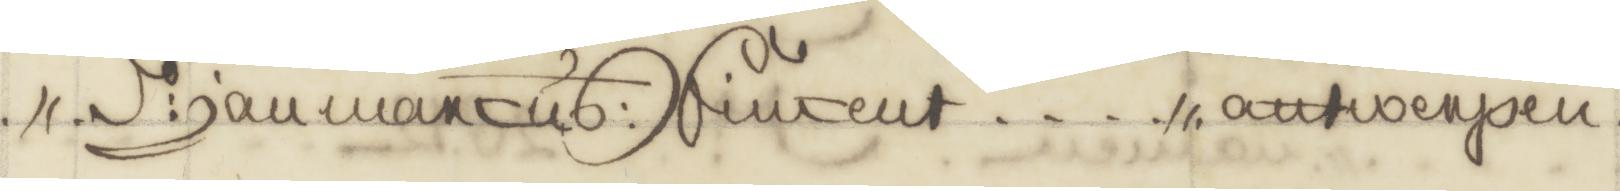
„ . d:o jan marcus: fincent - - - .„. antwerpen
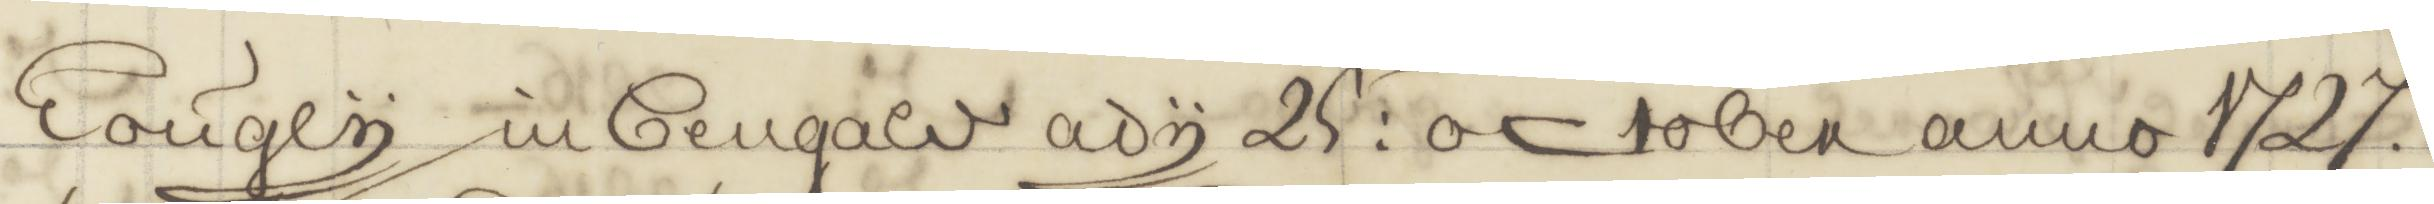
Houglij in bengale adij 25:' october anno 1727.
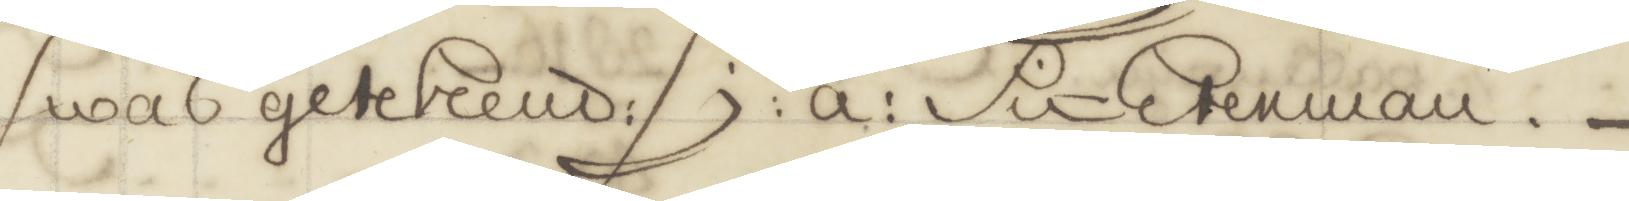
/was getekend:/ j: a: Sichterman.
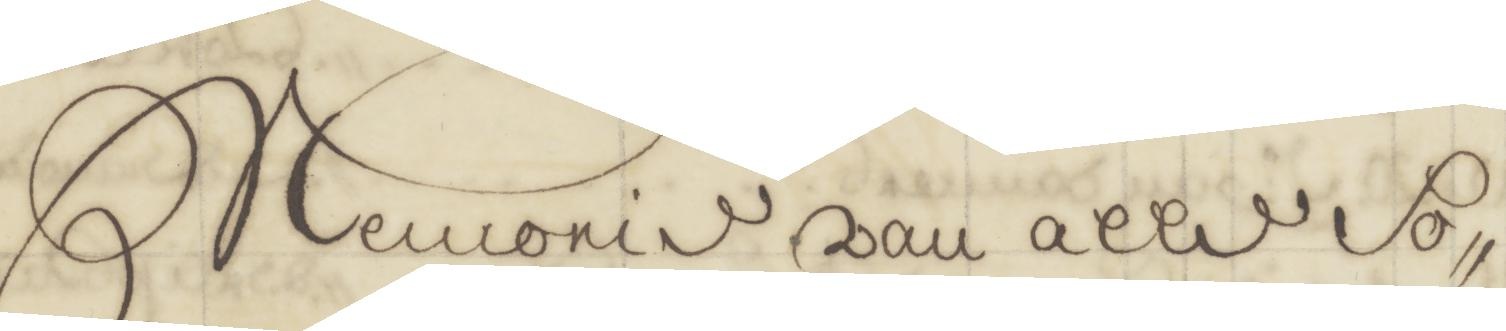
Memorie van alle So„
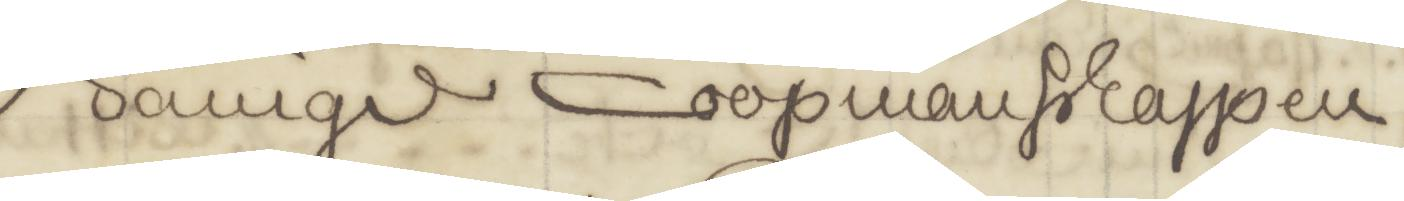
danige Coopmanschappen
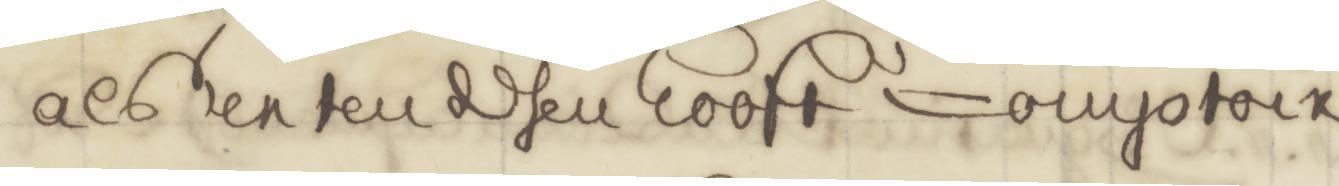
als 'er ten desen hooft Comptoire
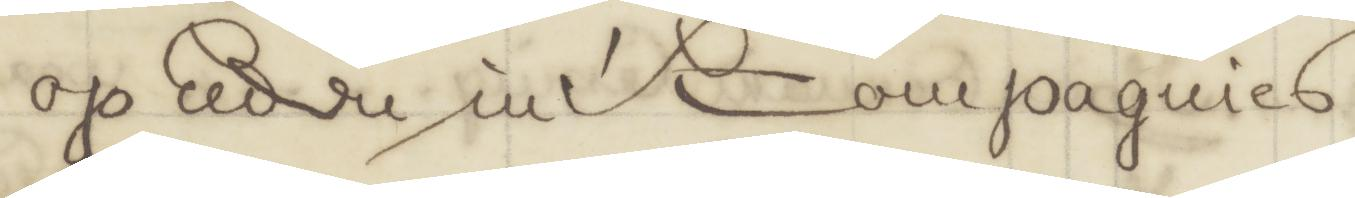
op heden in 'SCompagnies
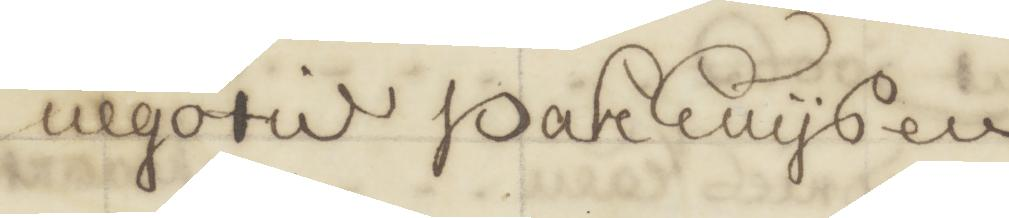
negotie pakhuijs en nog
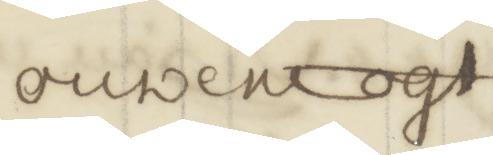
onvercogt
